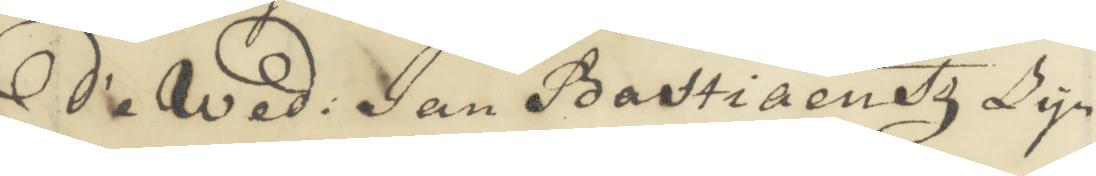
de Wed: Ian Bastiaensz zijn
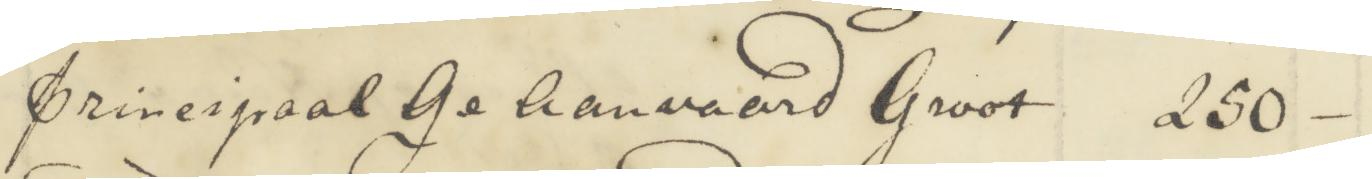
principaal ge Aanvaard Groot 250 —
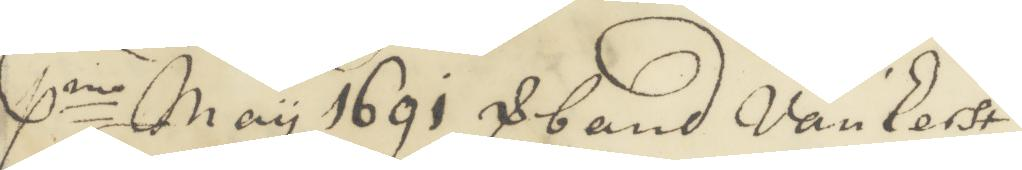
p=mo Maij 1691 verband van Eerst
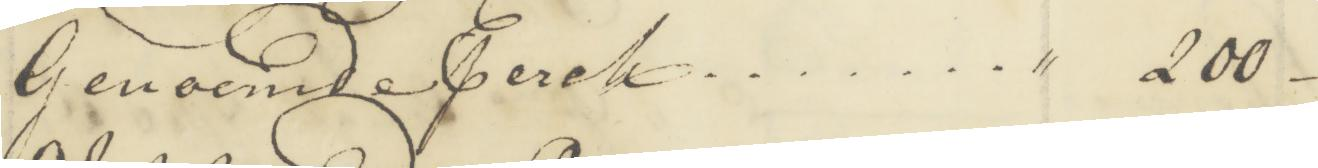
Genoemde perck . . . . . . . „ 200 -
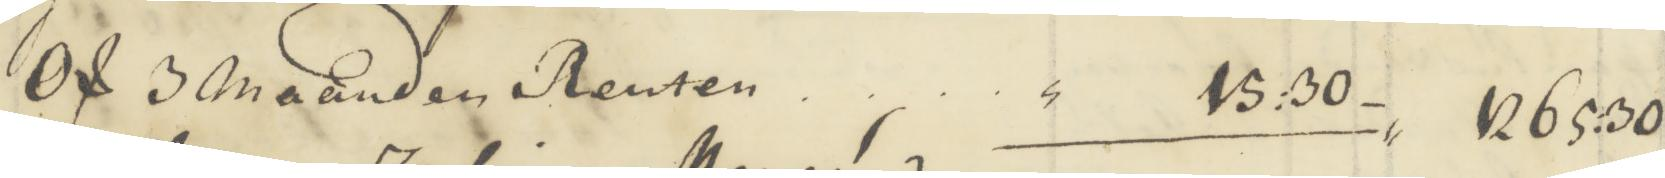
Over 3 maanden Renten . . . . „ 15.30 - „ 1265:30
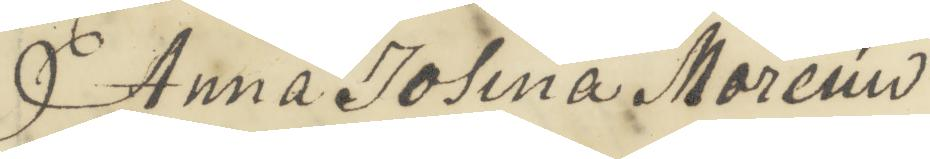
Anna Josina Moreuw
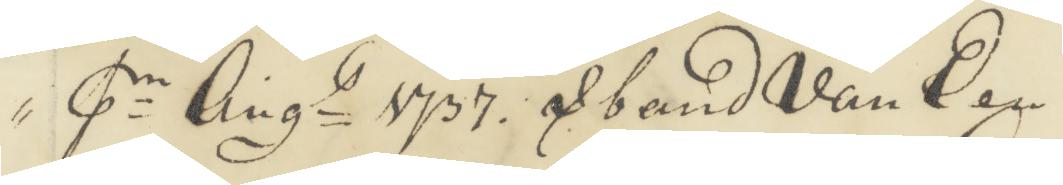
p=m Aug=s 1737. verband van Een
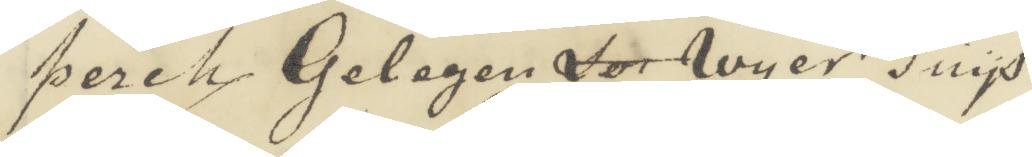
perck, Gelegen tot wy er huijs
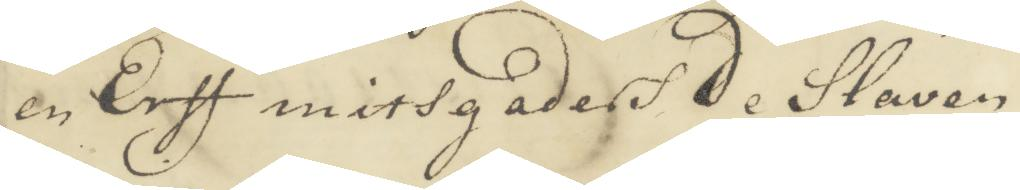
en Erff mitsgaders de slaven
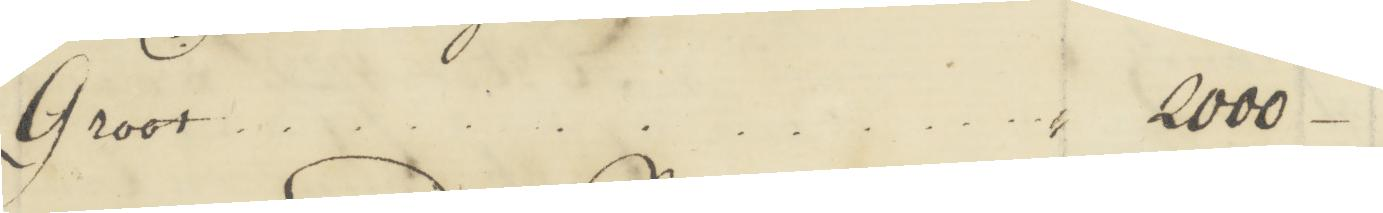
Groot . . . . . . . . . . . . . . „ 2000 —
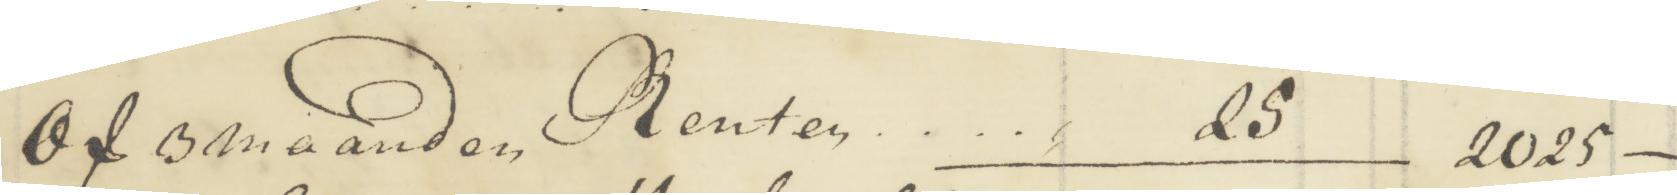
Over 3 maanden Renten . . . . „ 25 2025 —
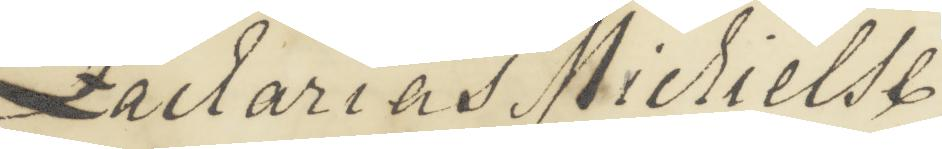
Zacharias Michielse
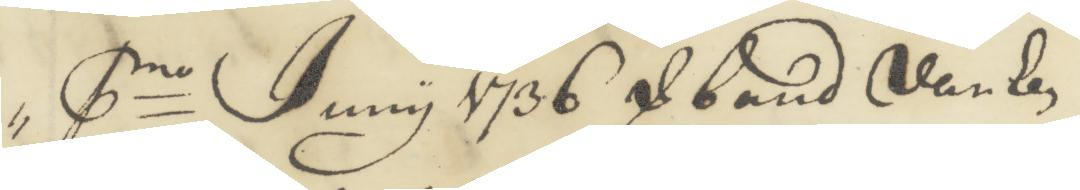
„ P=mo Junij 1736 verband van Een
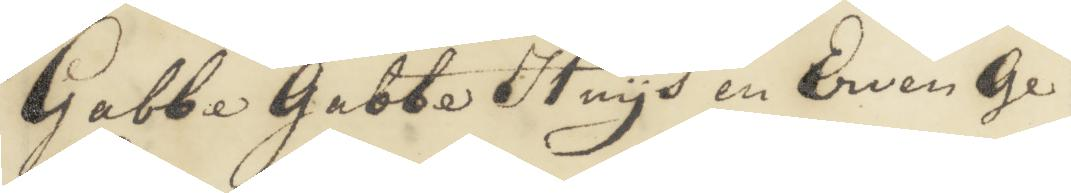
Gabbe Gabbe Huijs en Erven ge
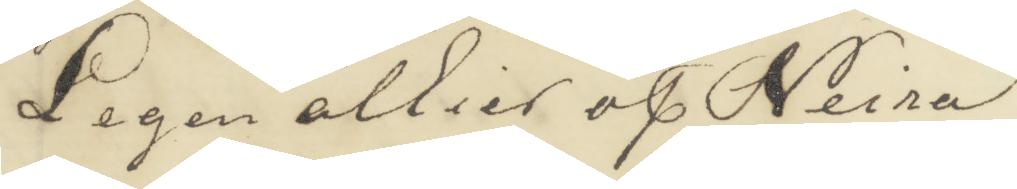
Legen alhier op Neira
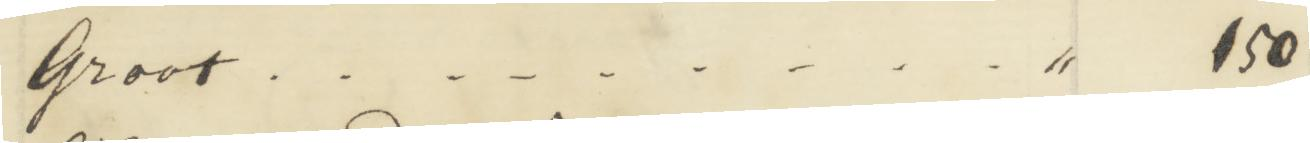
Groot - - - - - - - - - „ 150
